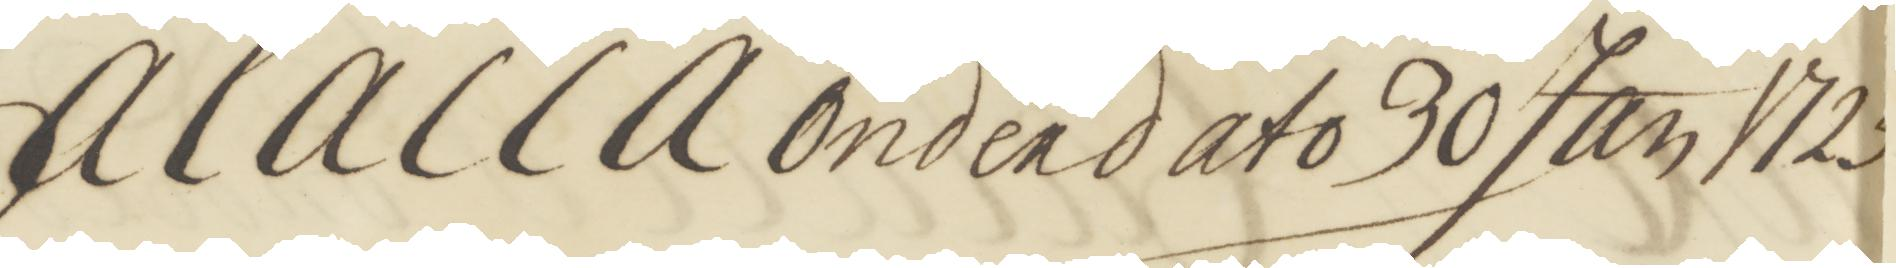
Van Malacca onder dato 30 Jan 172
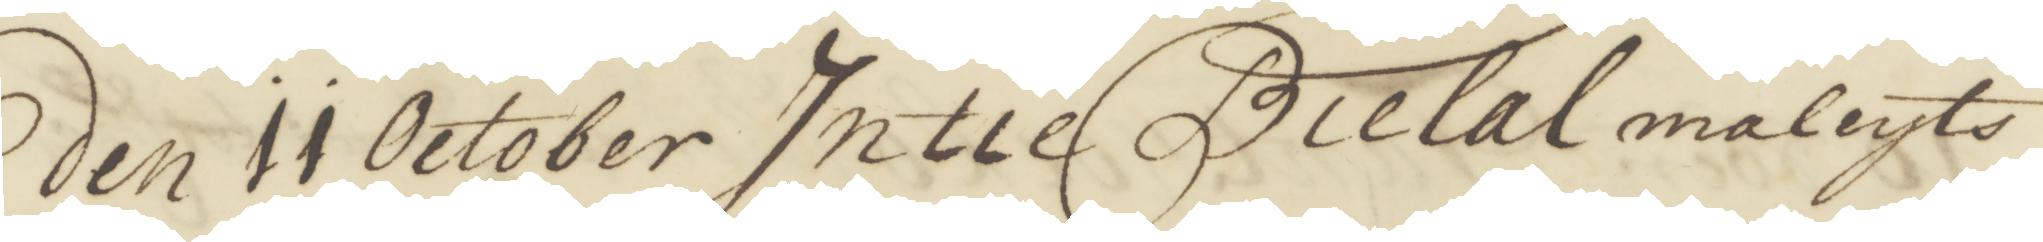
den 11 October Jntee Bielal maleyts
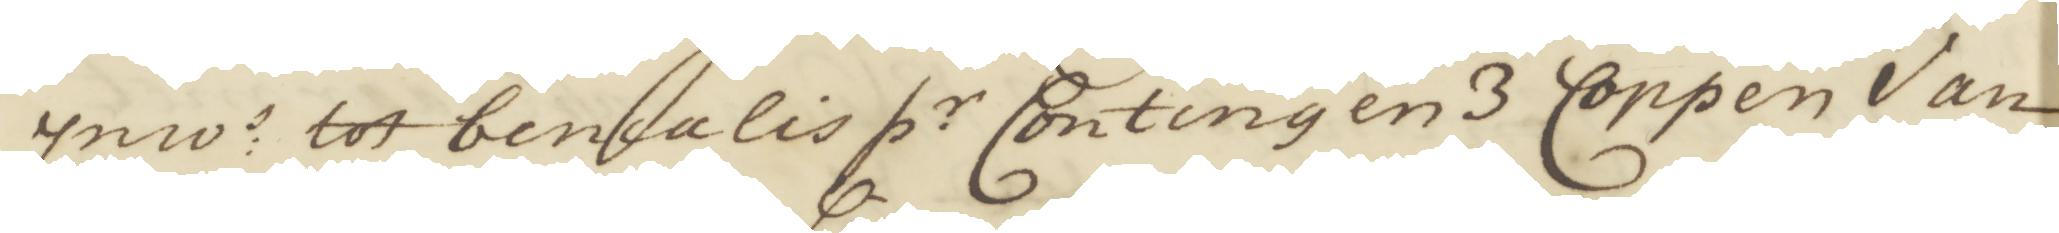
jnw:r tot bencalis p.r Conting en 3 Coppen van
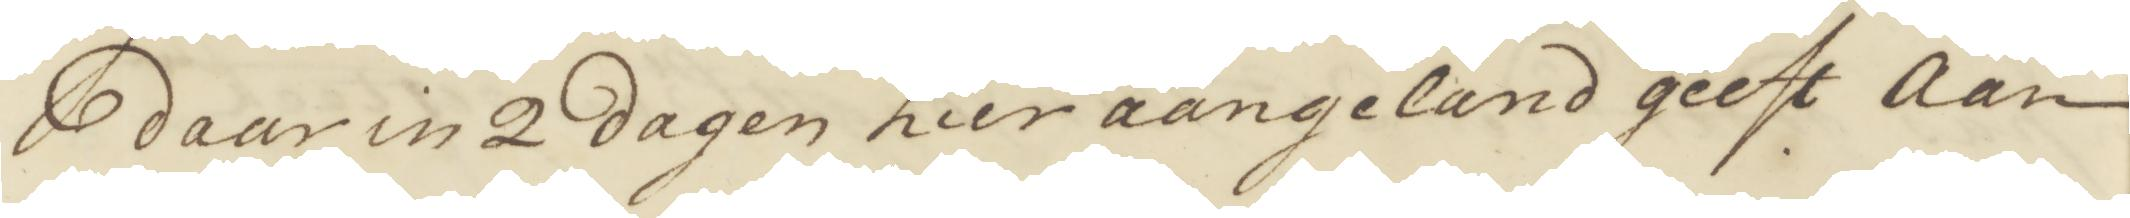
daar in 2 dagen hier aangeland geeft aan
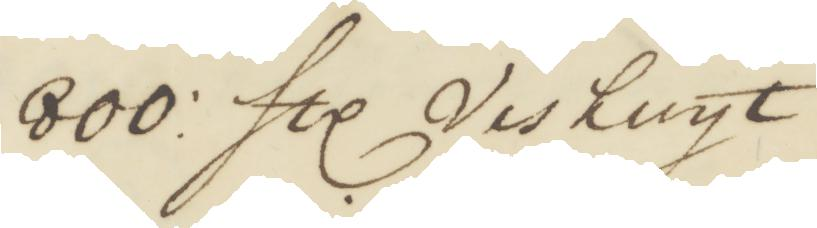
800: stx visluyt
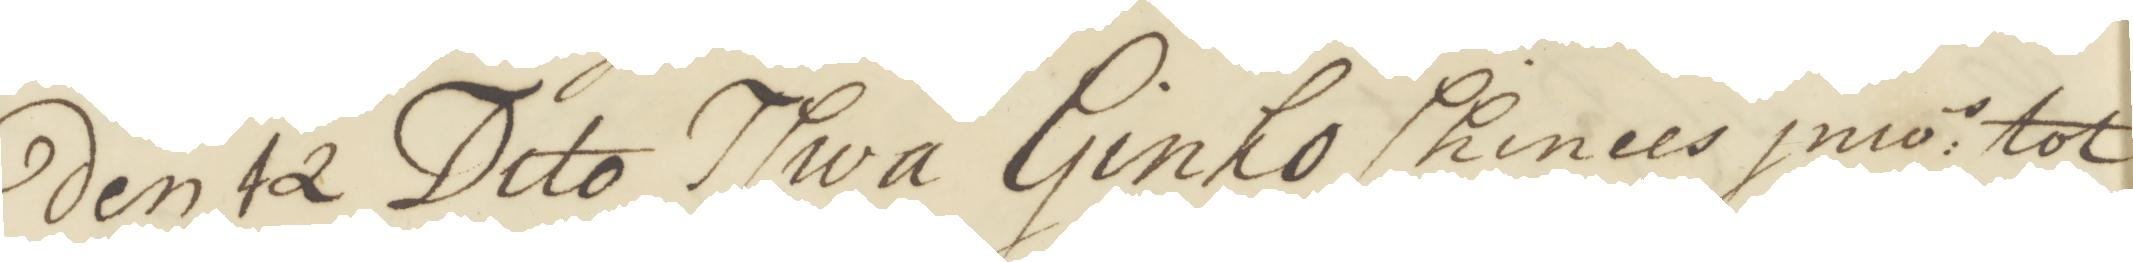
den 12 Dito Tswa Ginko Chinees jnw: tot
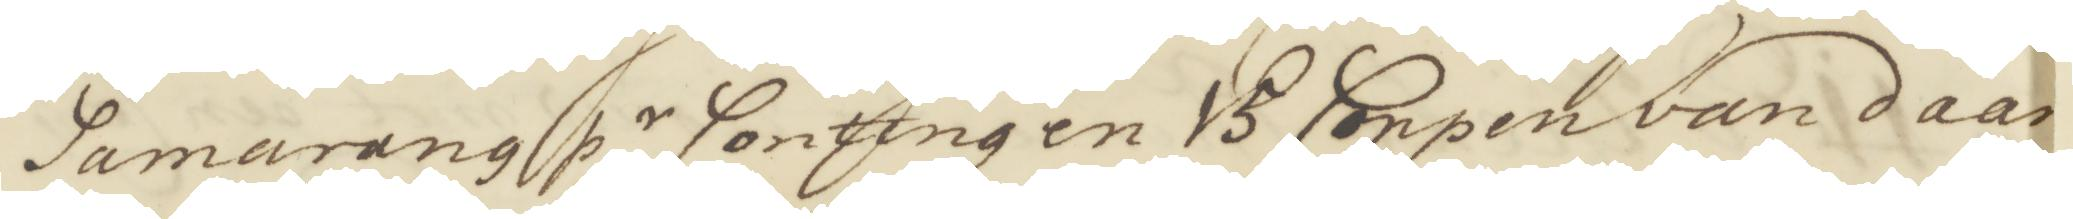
Samarang pr Conting en 15 Coppen van daar
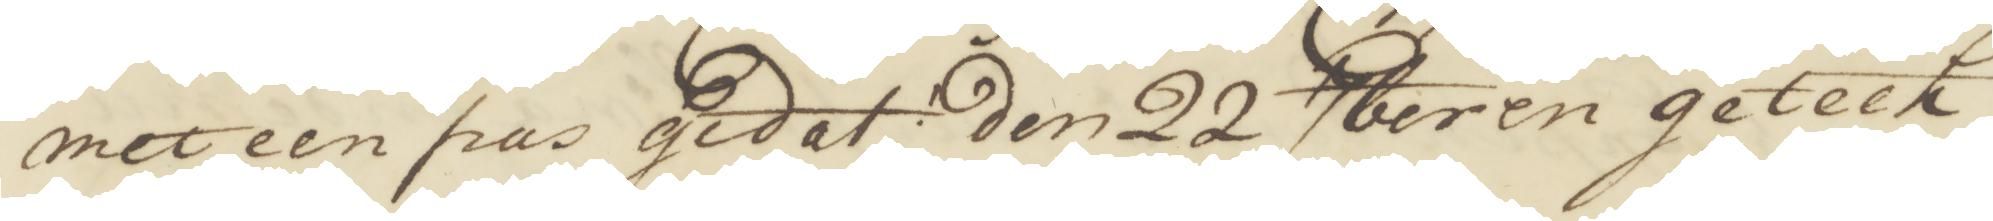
met een pas gedat: den 22 7ber en geteekt
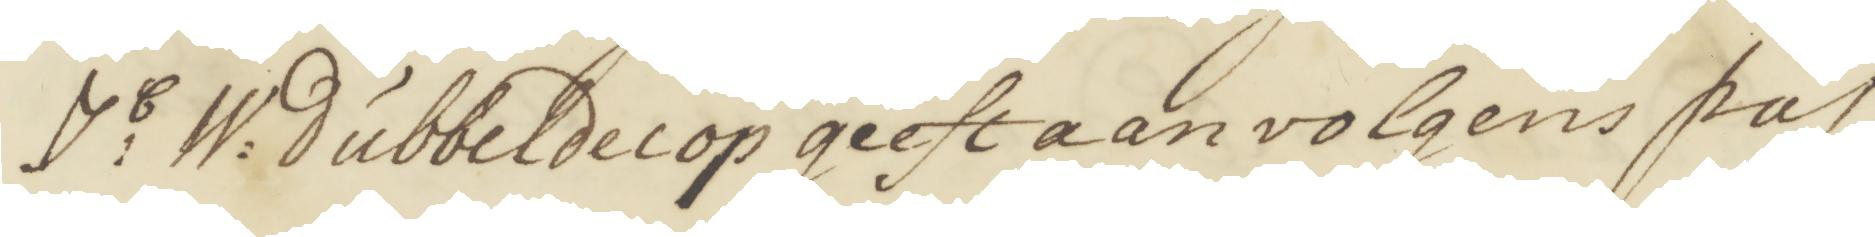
J:b W: dubbeldecop geest aan volgens pas
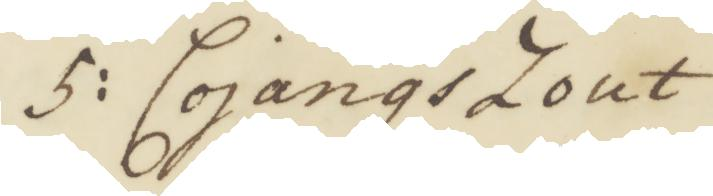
5: Cojangs zout
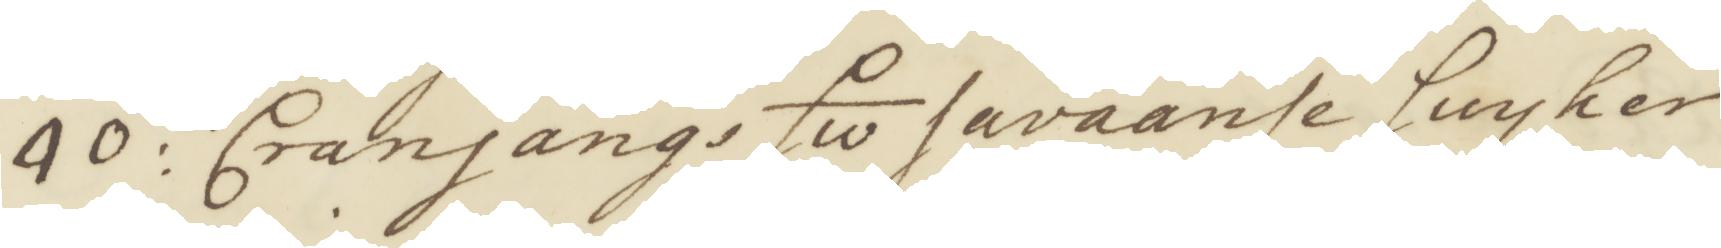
40: Cranjangs sw javaanse suyker
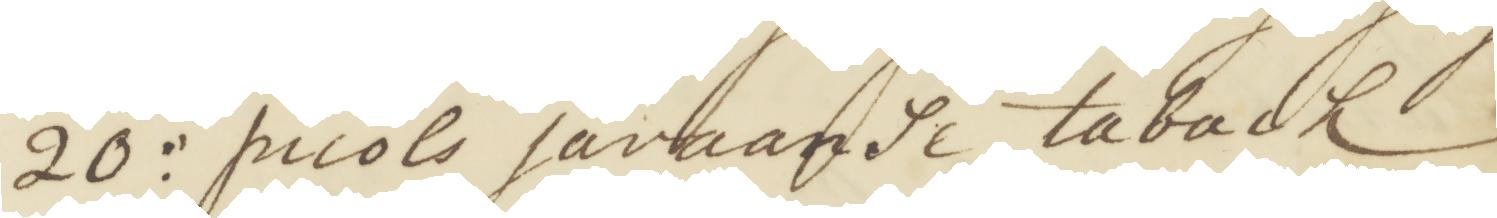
20: picols javaanse taback
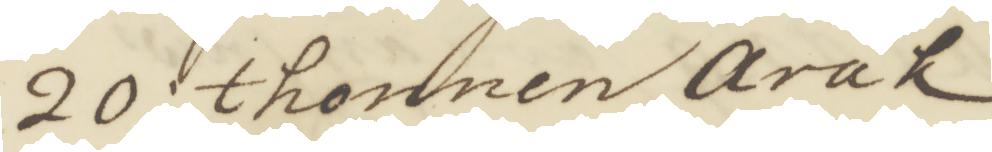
20: thonnen arak
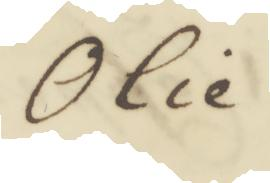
10: _o Olie
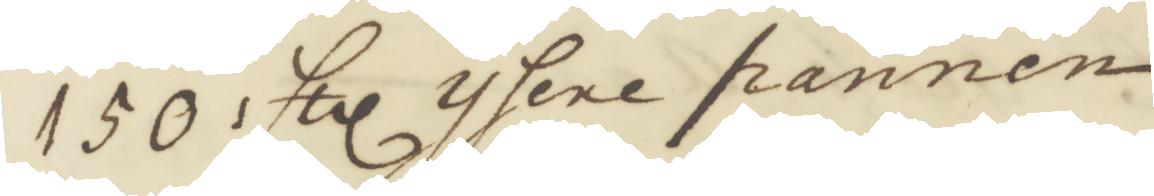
150: stx ysere pannen
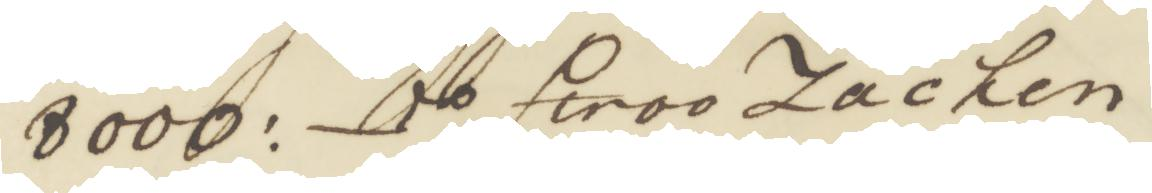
8006: _o stroo zacken
